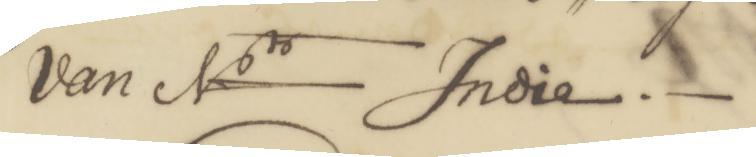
Van N=ts Jndia. —
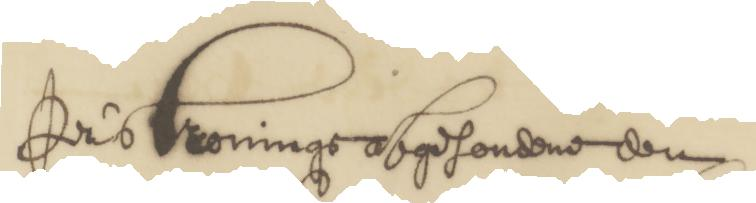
Per 'sKonings afgesondene den
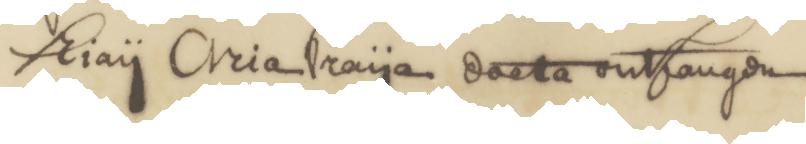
kiaij Aria sraija doeta ontfangen
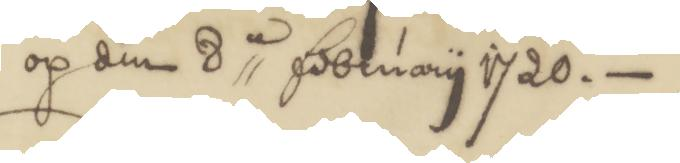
op den 8„n februarij 1720. —
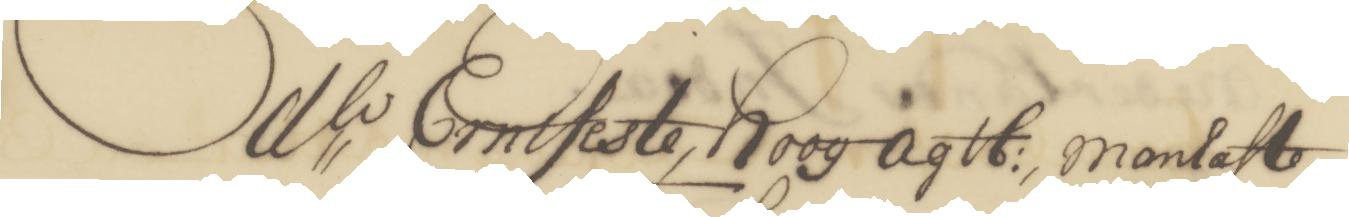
Ed„le Erntfeste, Hoog agtb:, manhafte,
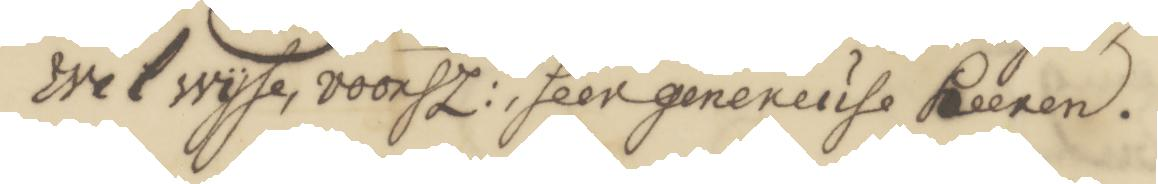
wel wijse, voorsz:, seer genereuse heeren.
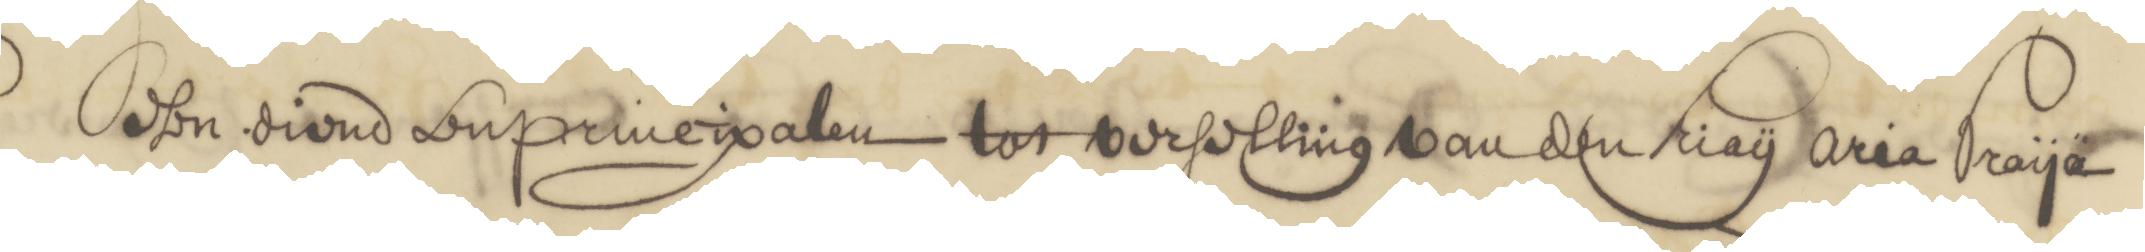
Desen diend ten principalen tot verselling van den kiaij aria sraijä
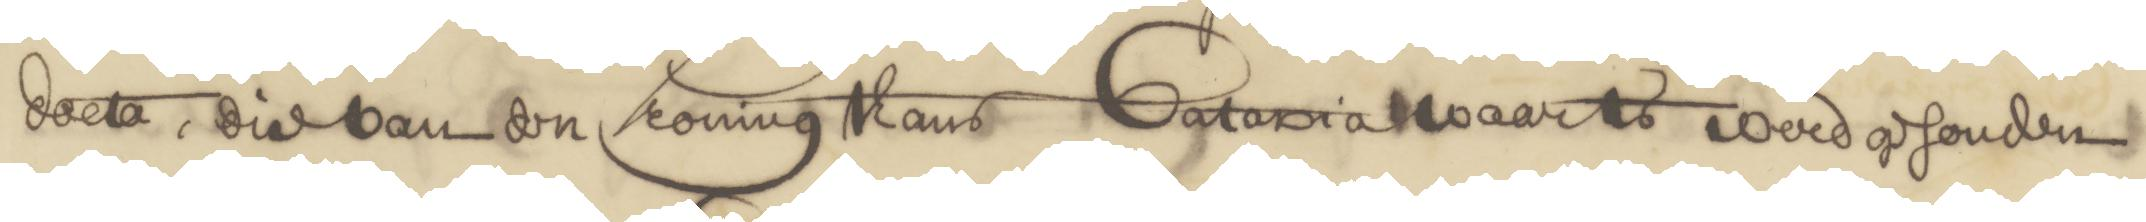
doeta, die van den koning thans Batavia waarts werd gesonden
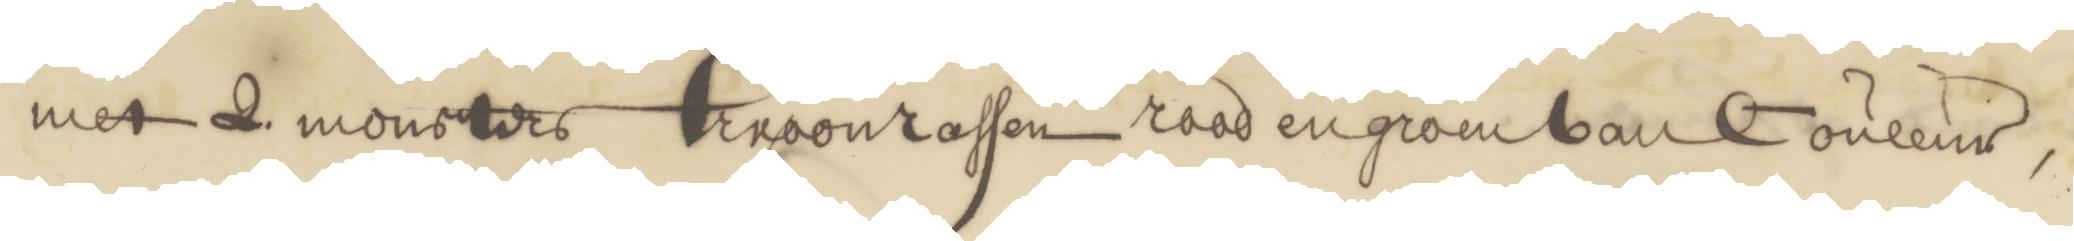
met 2. monsters kroonrassen rood en groen van Couleur,
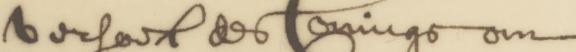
versoek des Conings om
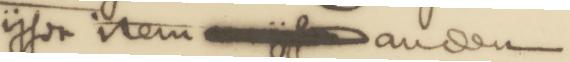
ijser item ijs anden
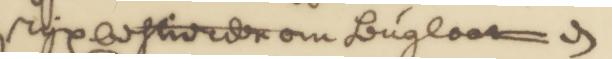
rijxbestierder om seugloot en
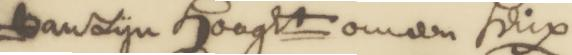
van zijn Hoogh=t omden schip
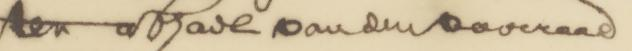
ter afhael van den voorraad
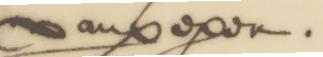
van peper.
